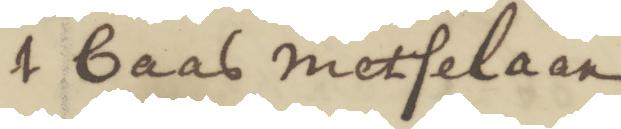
1 baas metselaar
